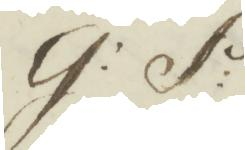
G: S:
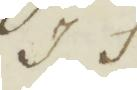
I. S
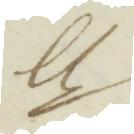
lb
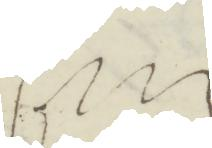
Cm
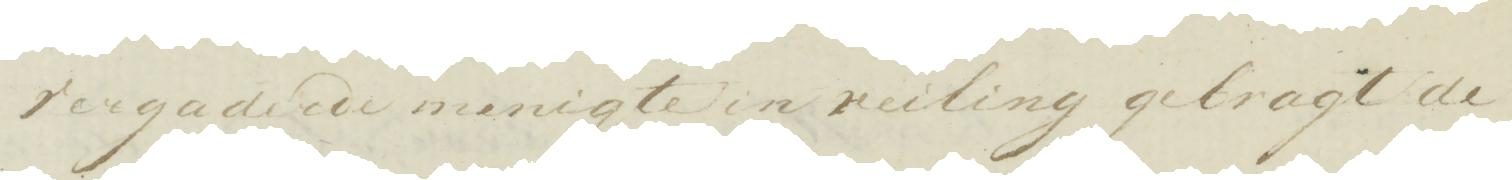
vergaderde menigte in veiling gebragt de
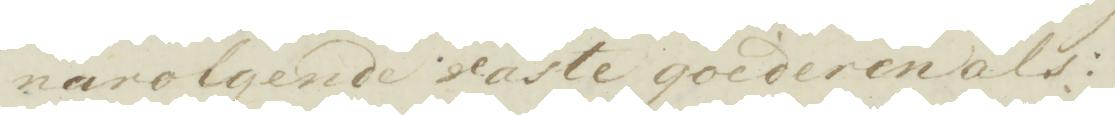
navolgende vaste goederen als:
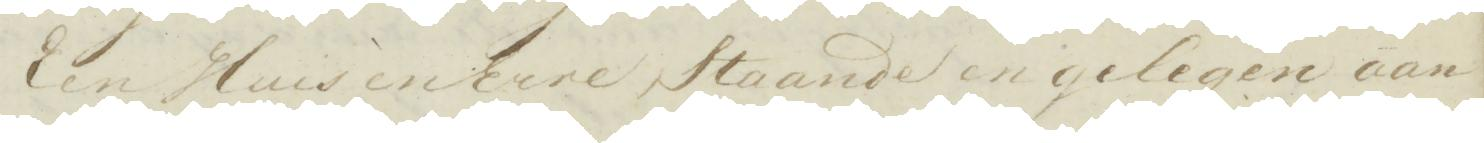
Een Huis en Erve, staande en gelegen aan
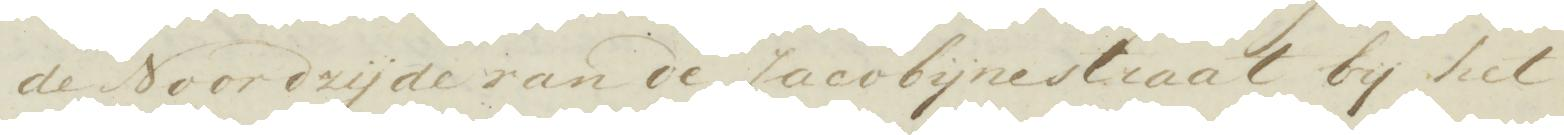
de Noordzijde van de Jacobijnestraat bij het
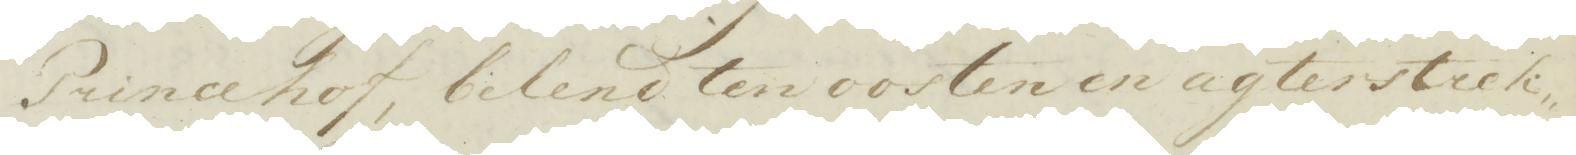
Princehof, belend ten oosten en agterstrek„
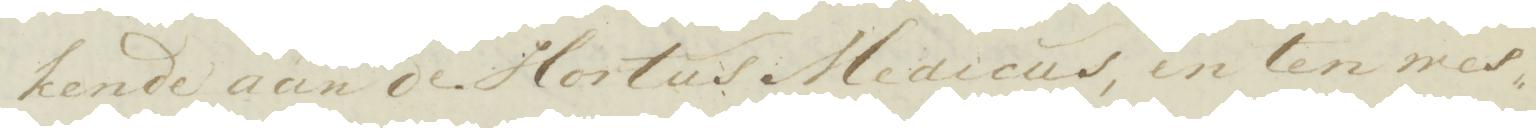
kende aan de Hortus Medicus, en ten wes„
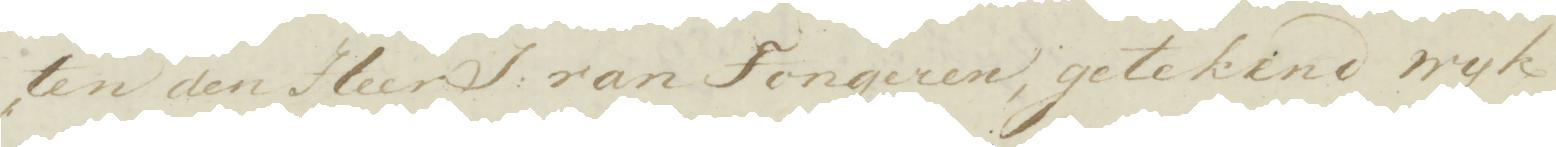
„ten den Heer J: van Tongeren, getekend wyk
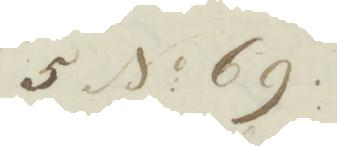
5 N:o 69.
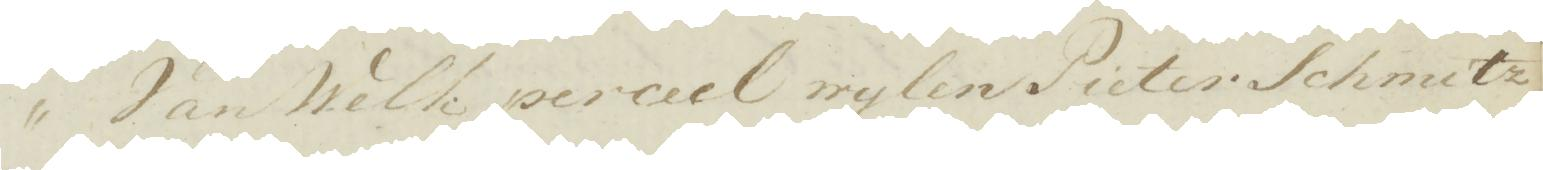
„ Van Welk perceel wijlen Pieter Schmitz
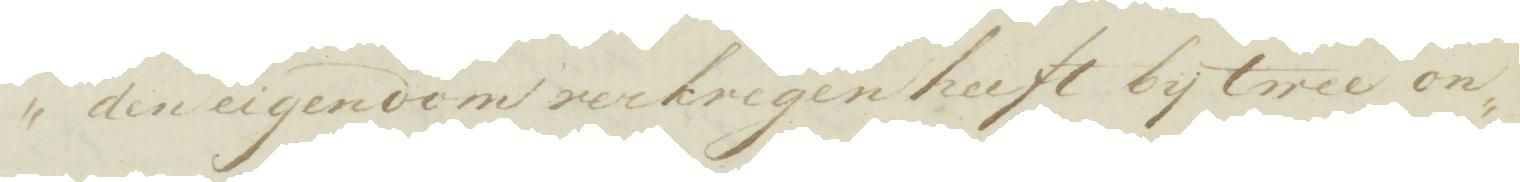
„ den eigendom verkregen heeft bij twee on„
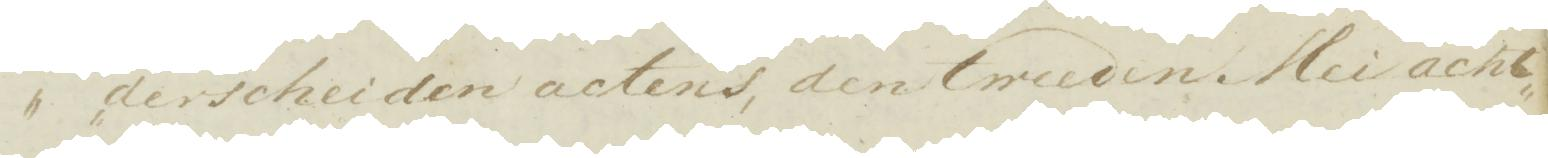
„ „derscheiden actens, den tweeden Mei acht„
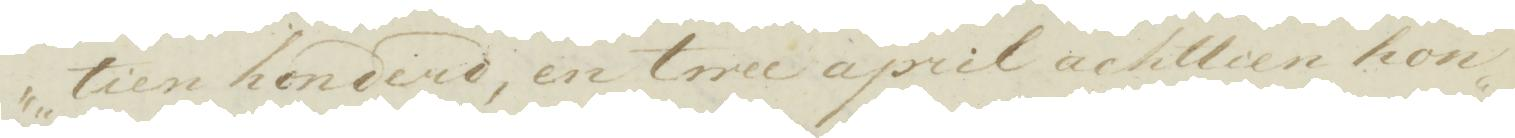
„„tien honderd, en twee april achttien hon„
